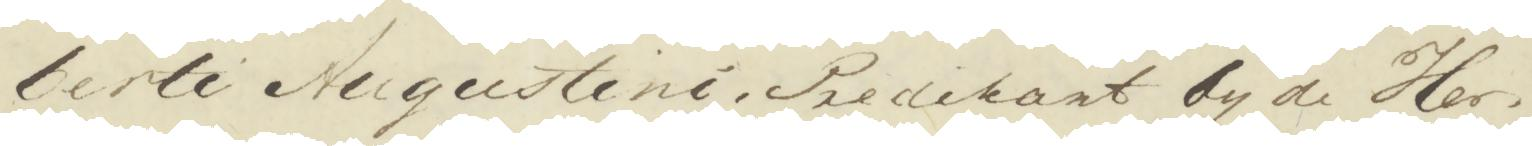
berti Augustini, Predikant bij de Her„
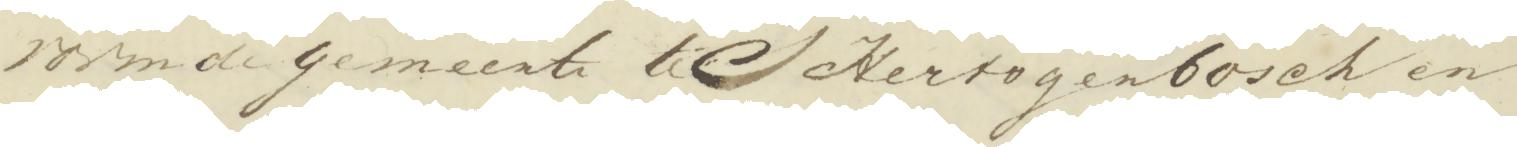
vormde gemeente te SHertogenbosch en
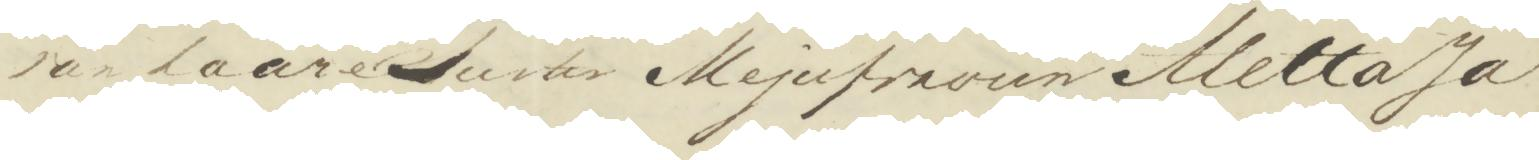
van haare Suster Mejufvrouw Aletta Ja
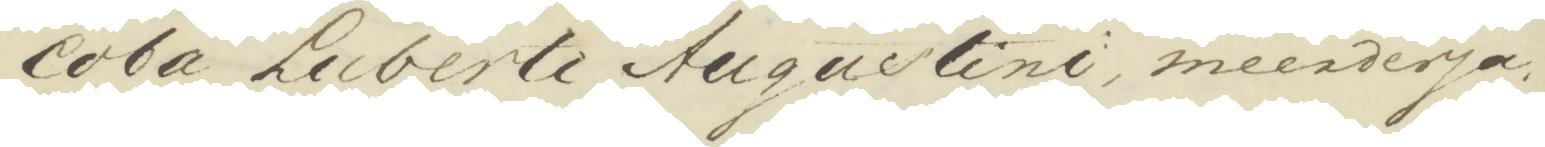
coba Luberti Augustini, meerderja„
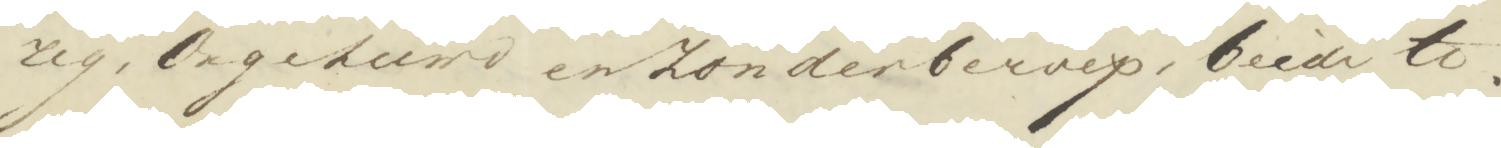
rig, Ongehuwd en zonder beroep, beide te
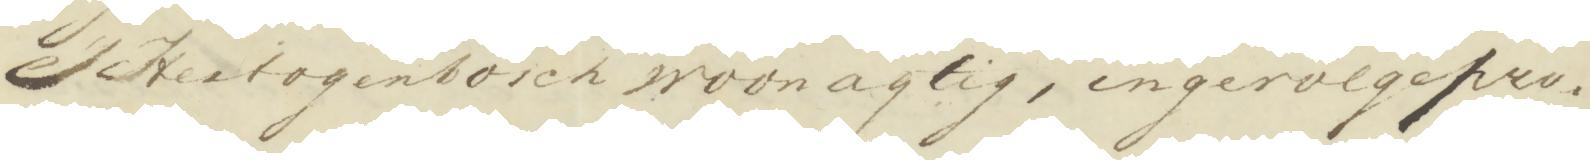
SHertogenbosch woonagtig, ingevolge pro„
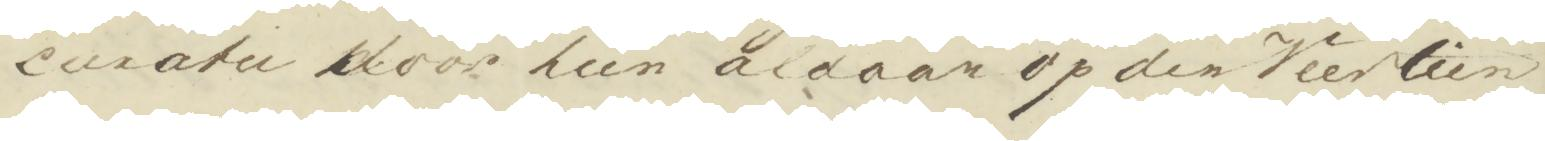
curatie door hun aldaar op den Veertien
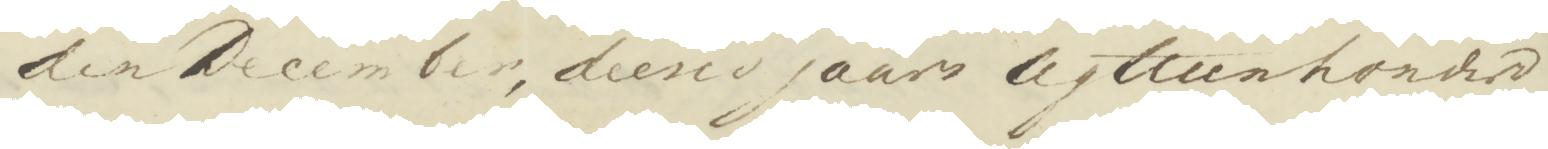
den December, deeses jaars Agttienhonderd
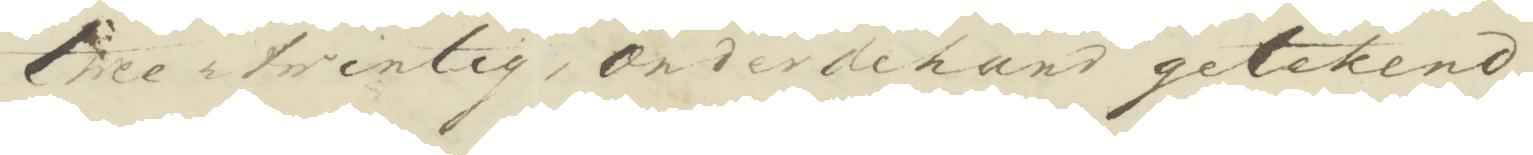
twee n twintig, onderdehand getekend,
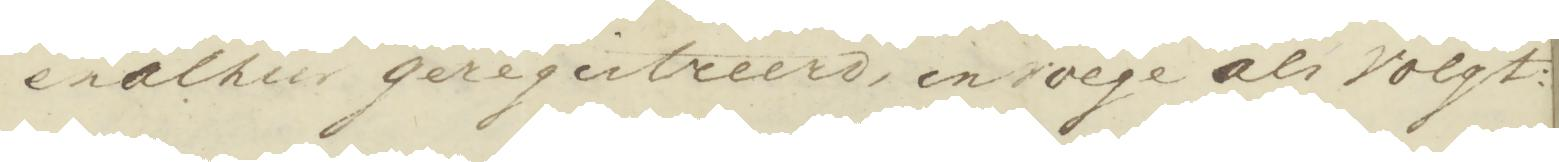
enalhier geregistreerd, in voege als volgt:
